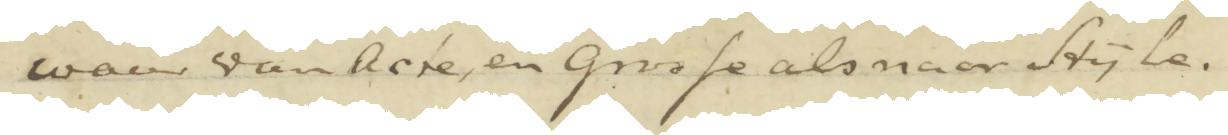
waar van acte, en grosse als naar stijle.
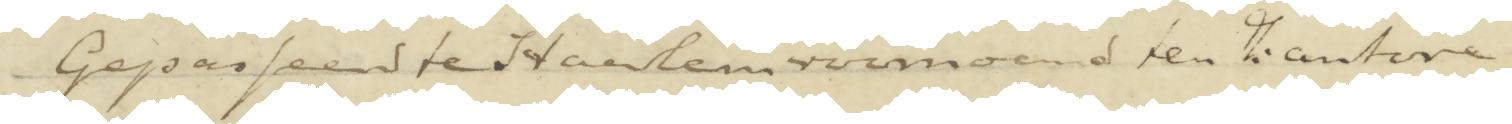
Gepasseerd te Haarlem voornoemd ten Kantore
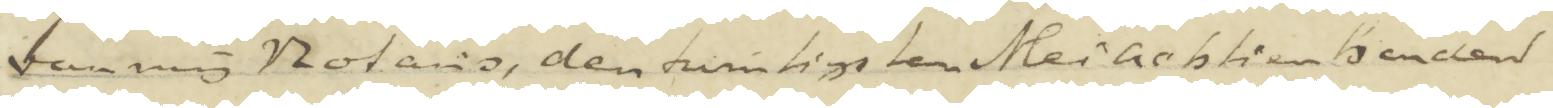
van mij Notaris, den twintigsten Mei achtien honderd
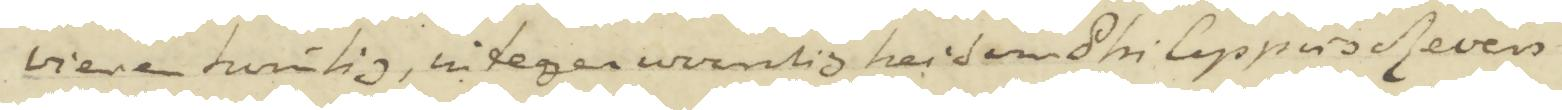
vierentwintig, integenwoordigheid van Philippus Revers
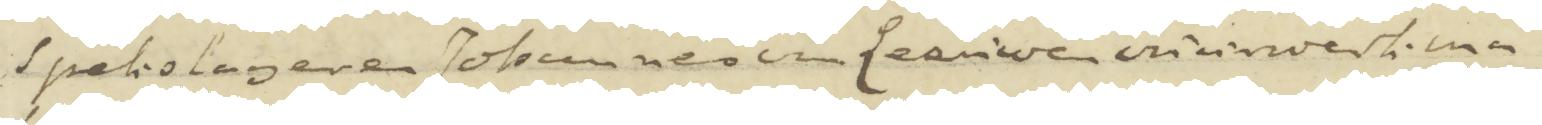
Spekslager en Johannes van Lesuive uuirwerkma
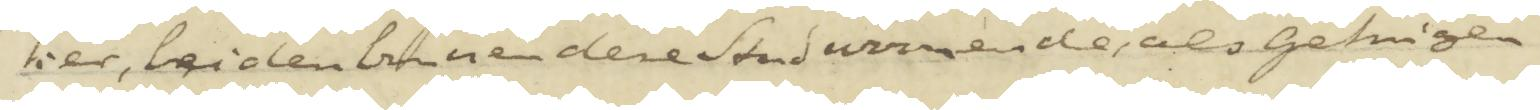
ker, beiden binne dese Stad woonende, als getuigen
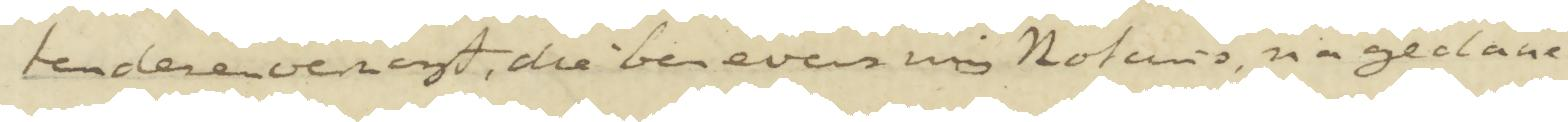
ten dezen verzogt, die benevens mij Notaris, na gedane
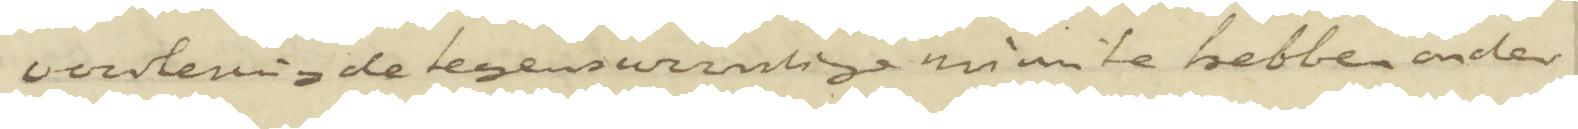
voorlezing de tegenswoordige minute hebben onder
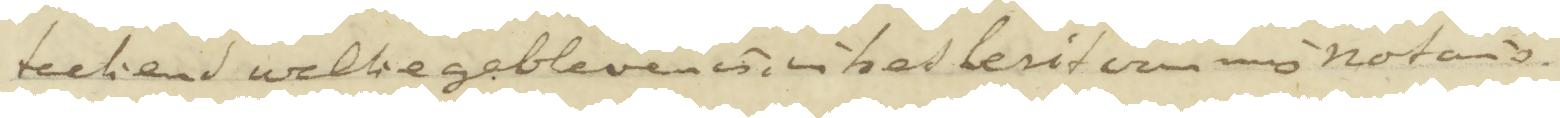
teekend welke gebleven is in het bezit van mij notaris.
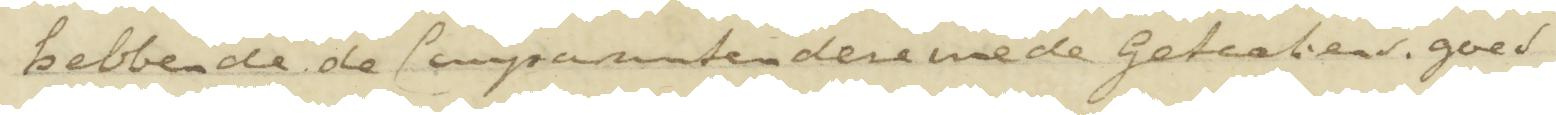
hebbende de Comparanten dese mede Geteekend. goed
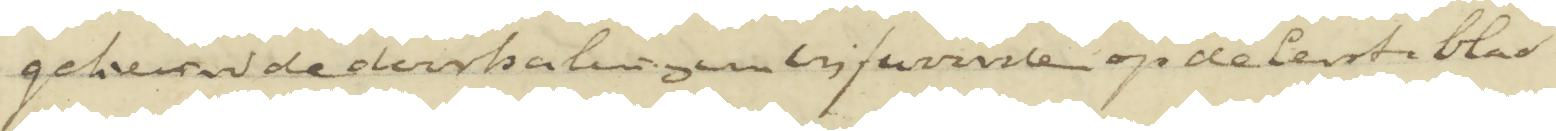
gekeurd de doorhalingen vijf woorden op de leste blad
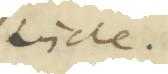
zijde.
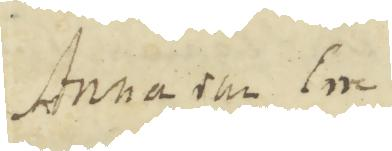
Anna van Ewe
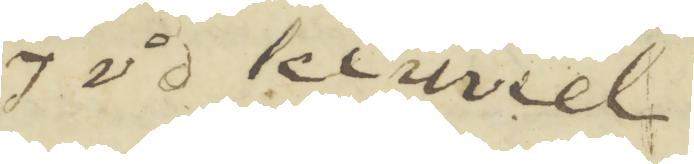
J v d Kerveel
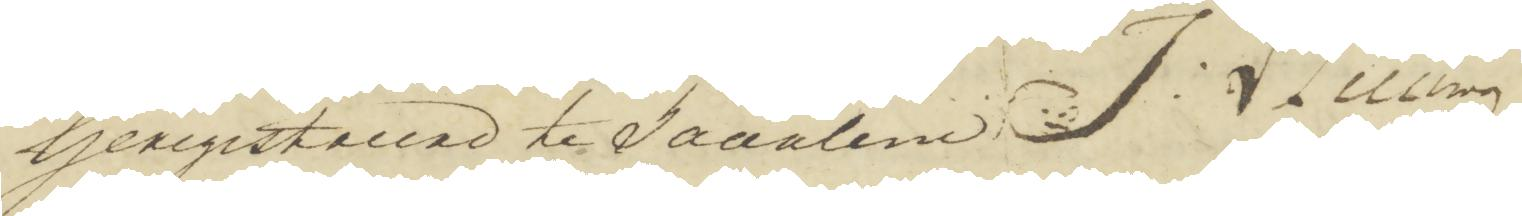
Geregistreerd te Haarlem J: v Lening
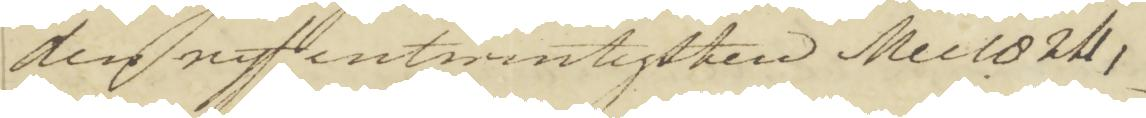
den vijf en twintigsten Mei 1824,
